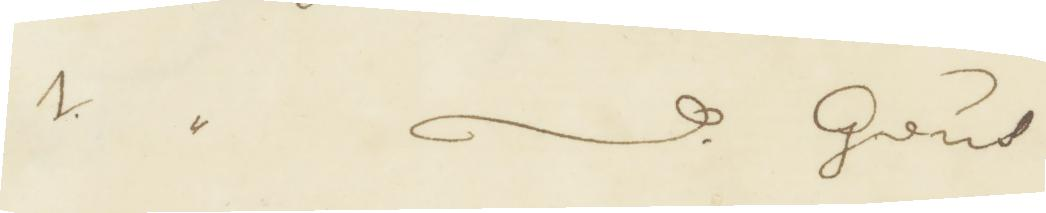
1. „ _.o Geus
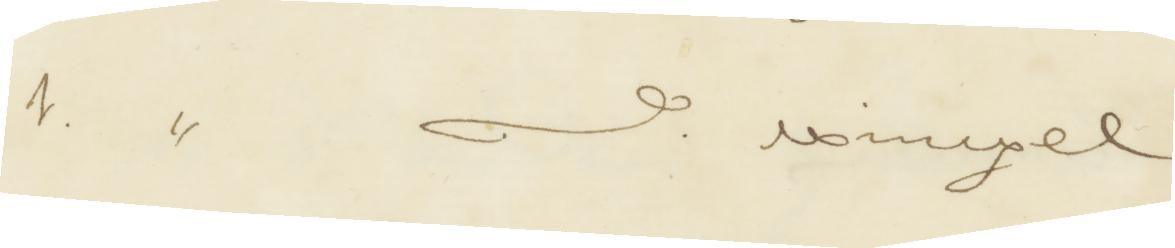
1. „ _.o wimpel
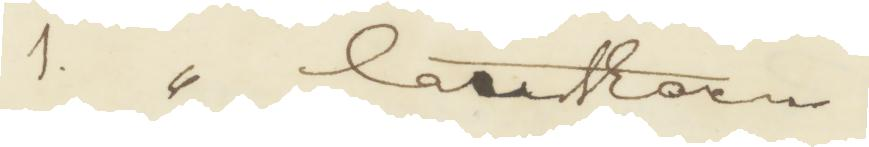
1. „ lanthorn
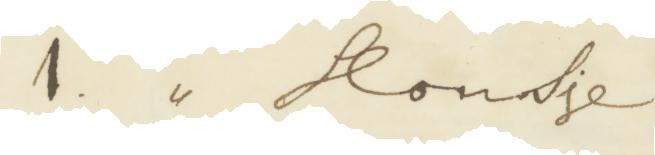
1. „ slonsje
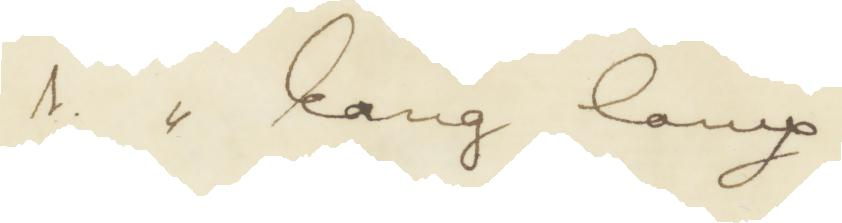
1. „ hang lamp
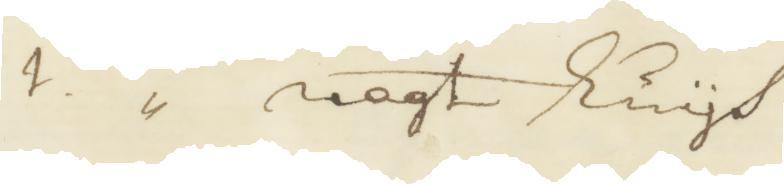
1. „ nagt huijs
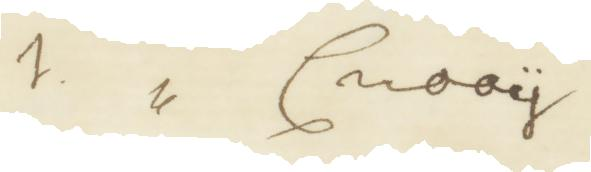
1. „ Cnooij
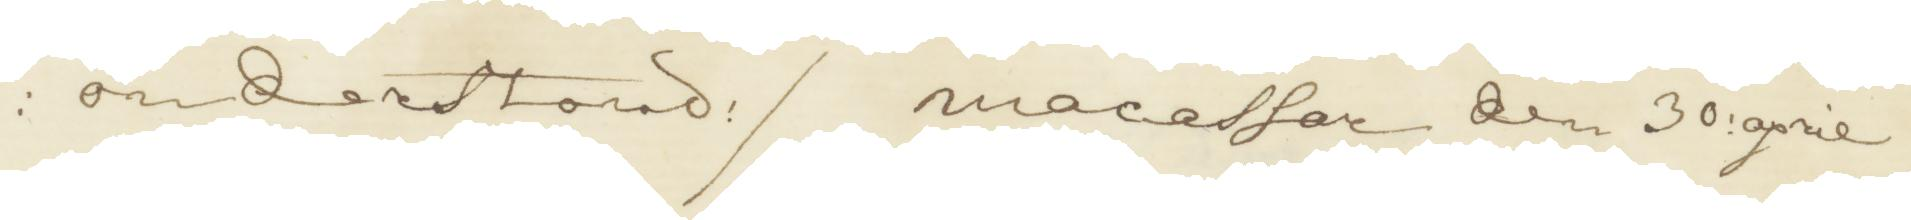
/:onderstond:/ macassar den 30:' april
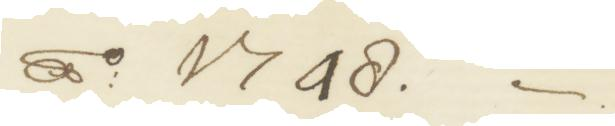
a:o 1748. —
